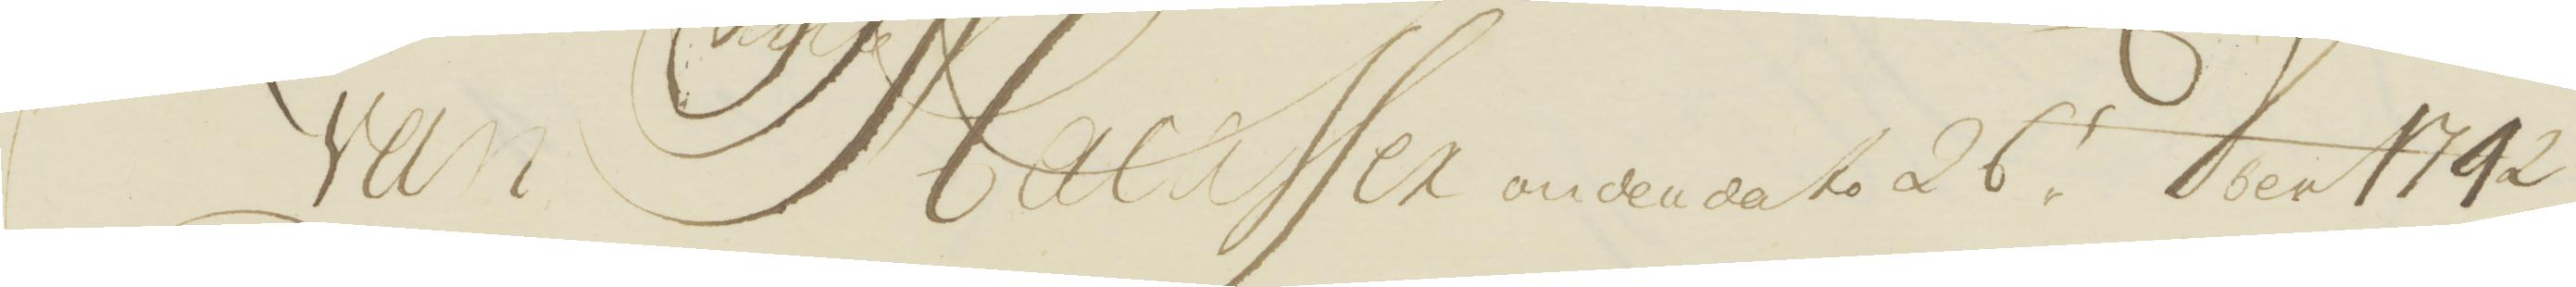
Van Macasser onder dato 26„' 8ber 1742
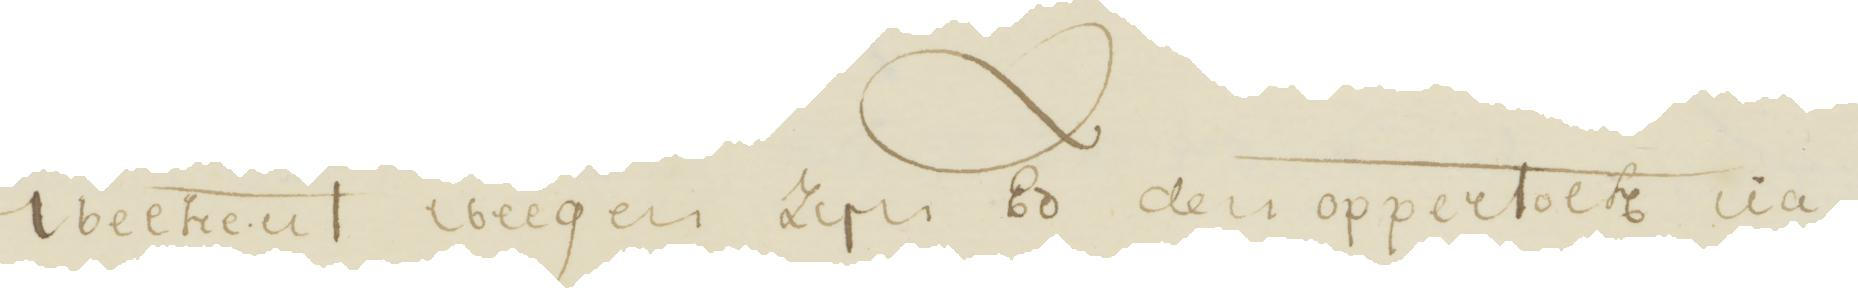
welkent weegen zijn Ed den oppertolk na
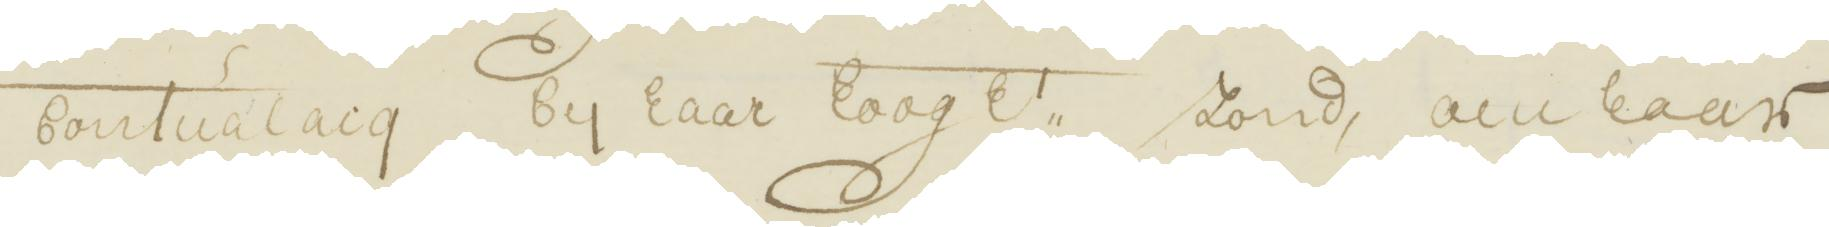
bontualacq bij haar hoogh„t zond, aen haar
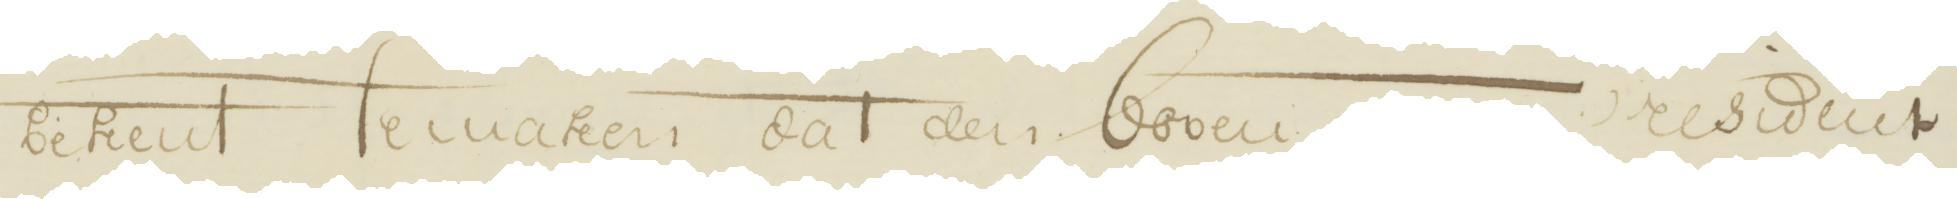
bekent te maken dat den boven gem. resident
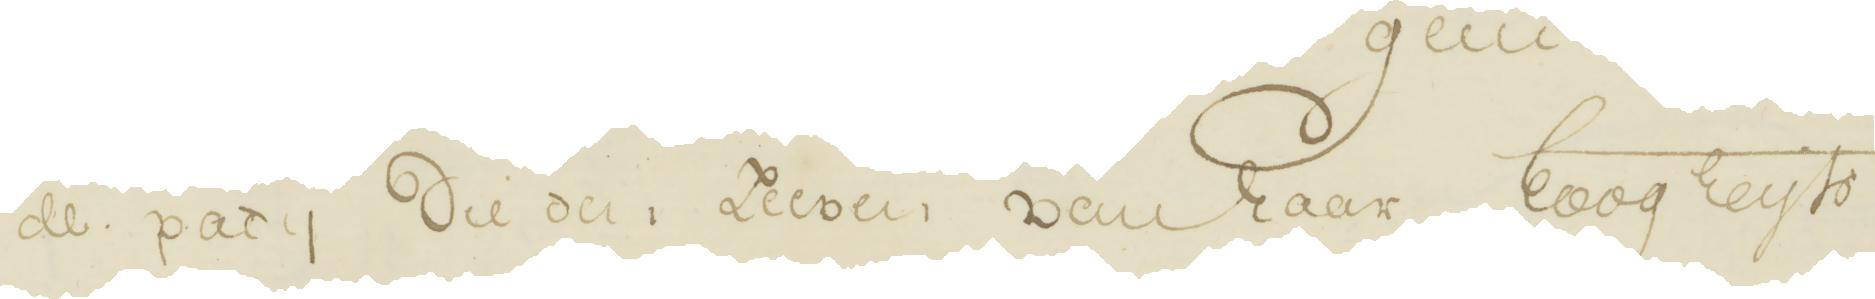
de patij die den zeeven van haar hoogheijts
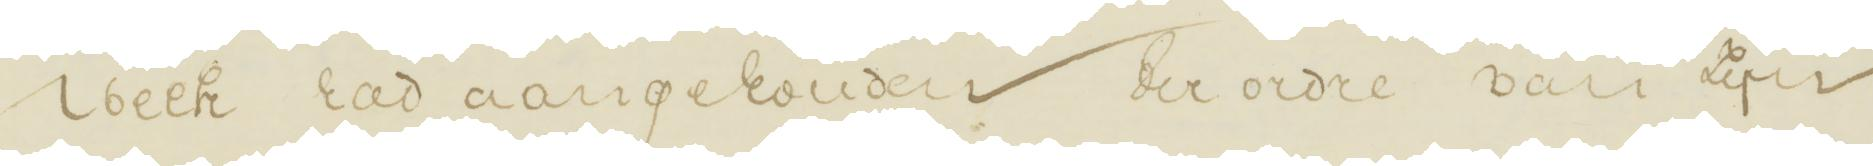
week had aangehouden der ordre van zyn
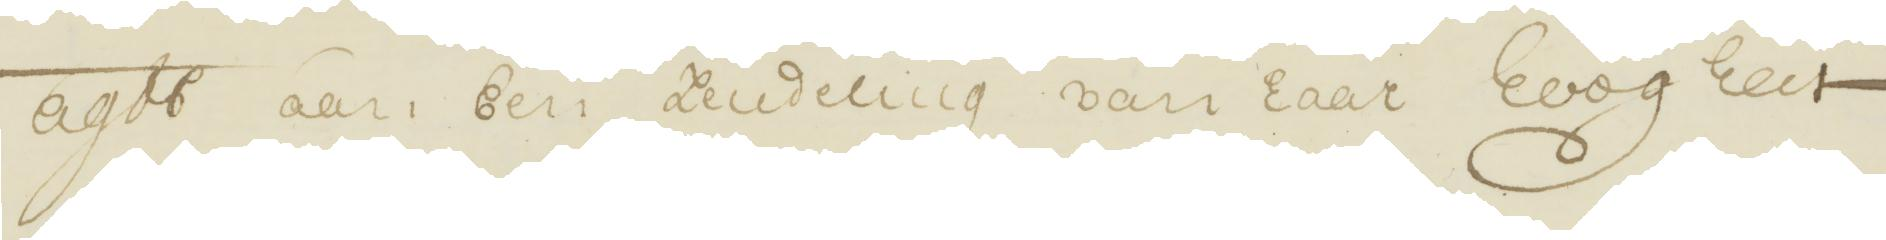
agtb aan Een zendeling van haar hoog heit
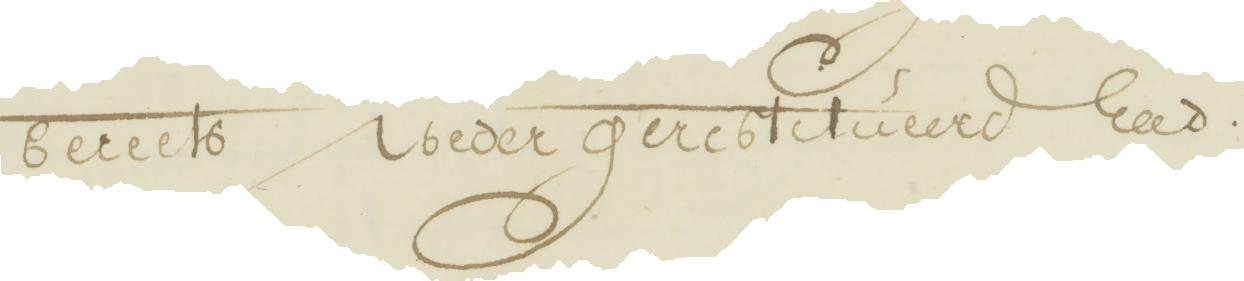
bereets weder gerestitueerd had.
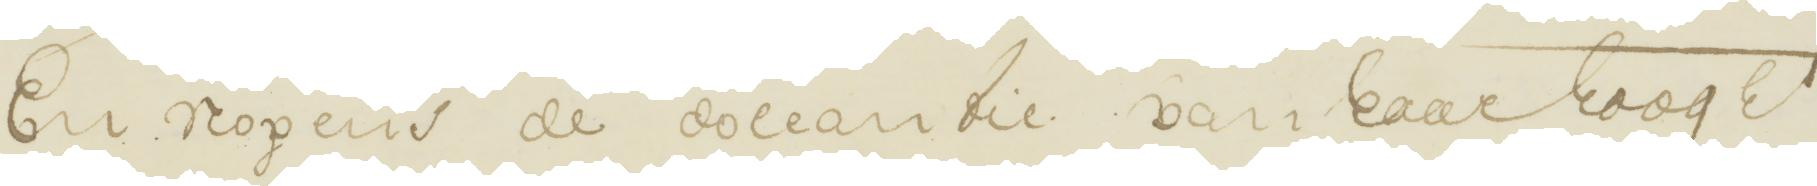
En nopens de doleantie van haar hooght
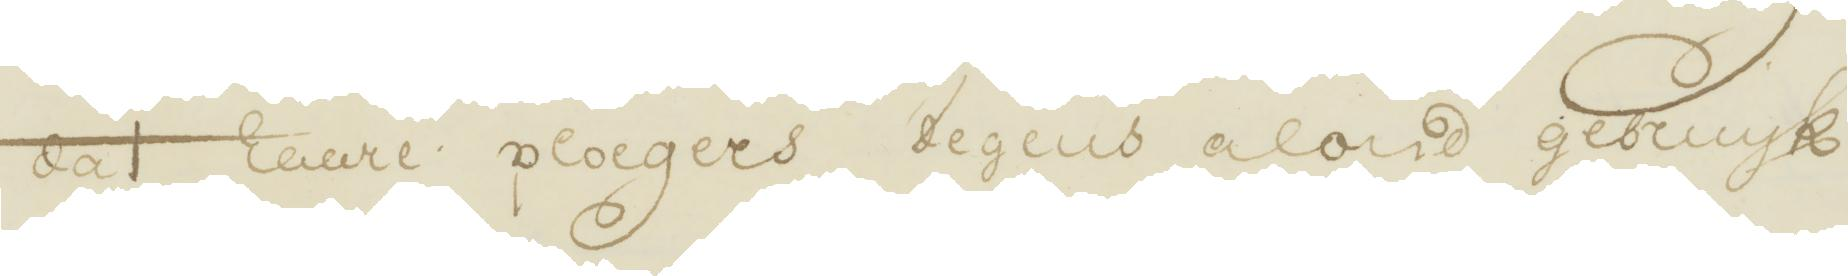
dat haare ploegers tegens aloud gebruyk
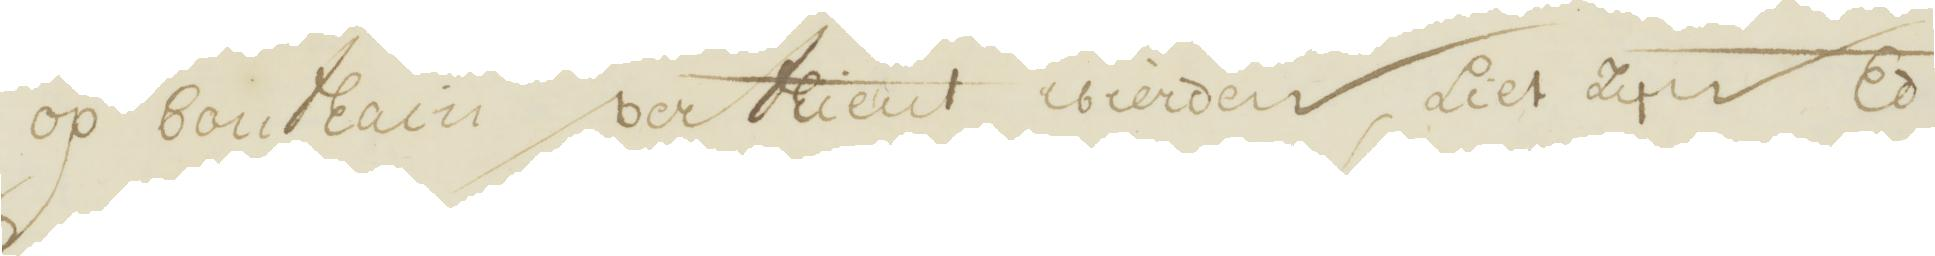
op bouthain verthiert wierden, liet zyn Ed
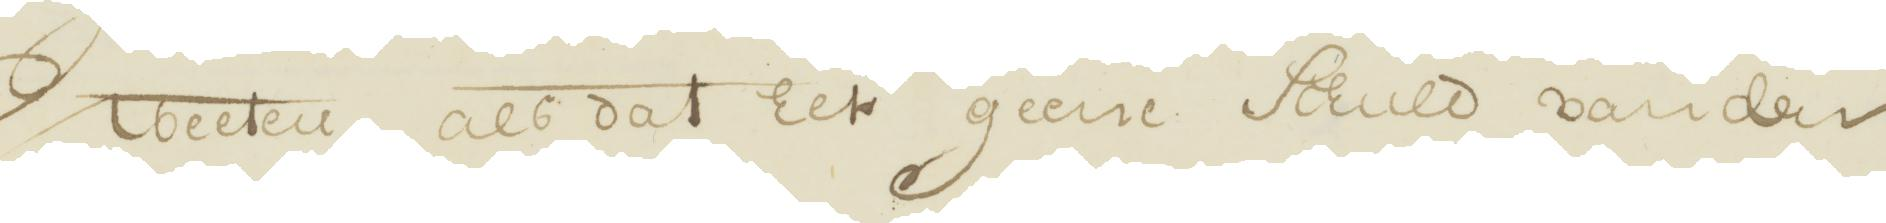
weeten als dat het geene schuld van den
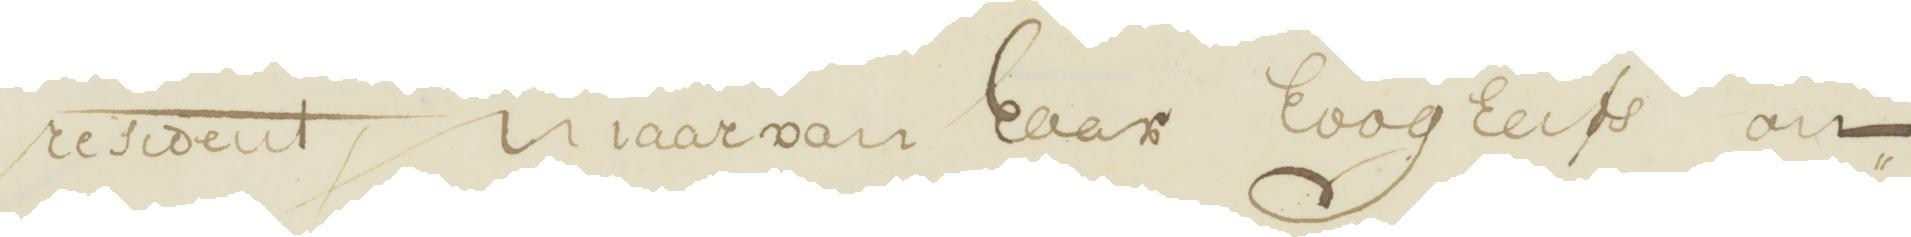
resident, maar van haar hoogheits on„
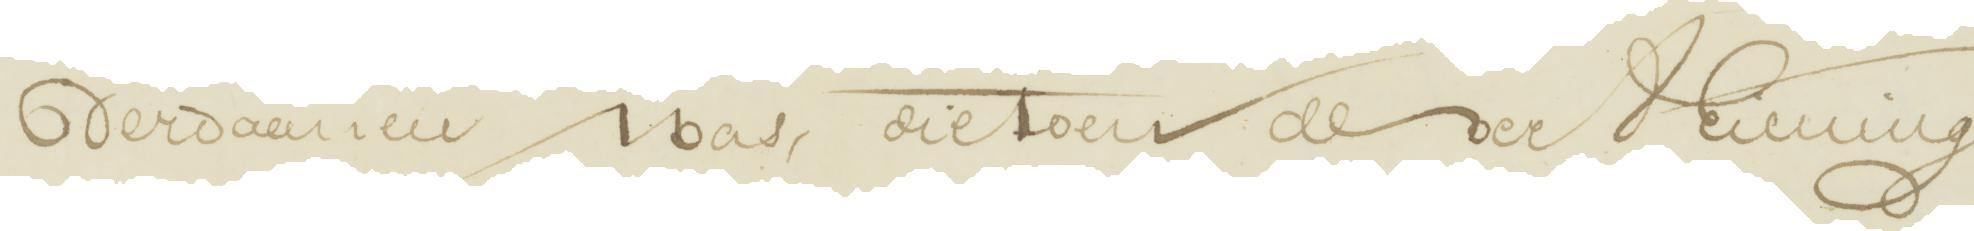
derdaanen was, die toen de verthiering
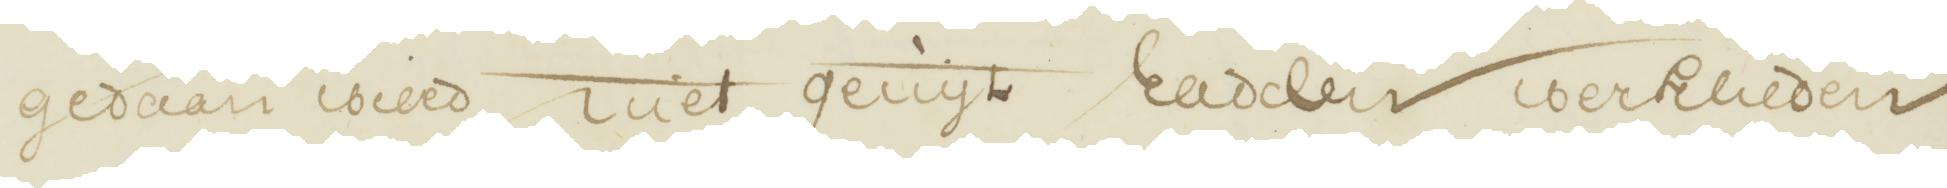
gedaan wierd niet geuijt hadden werklieden
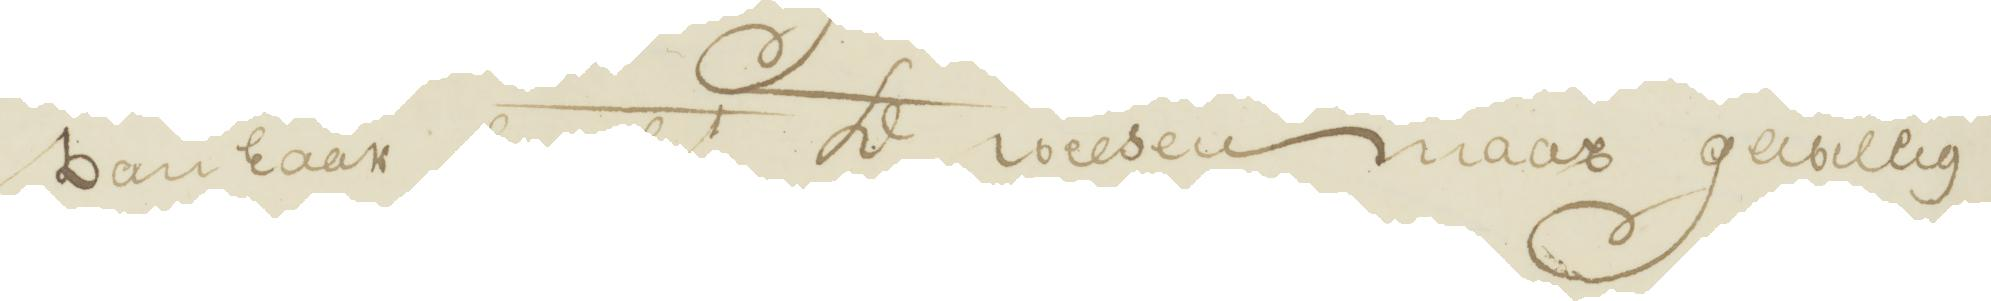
van haar hoogh„t te weesen maar gewillig
